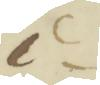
do -
